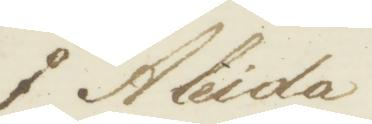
¶ Aleida
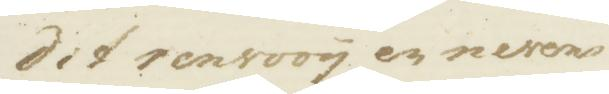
dit renvooij en nevens
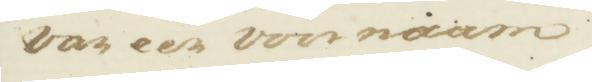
van een voornaam
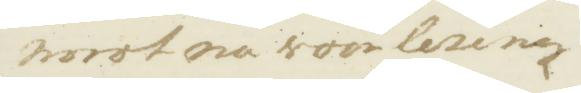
wordt na voorlezing
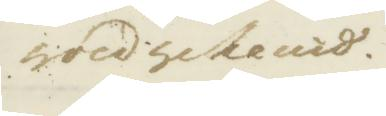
goed gekeurd.
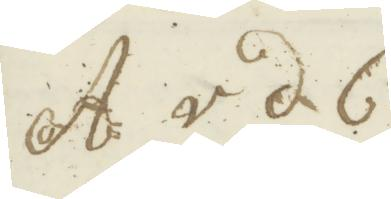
A v d C
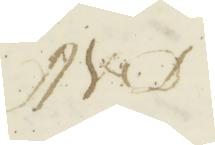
A N D
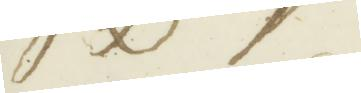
J D V
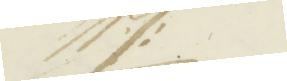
wS:
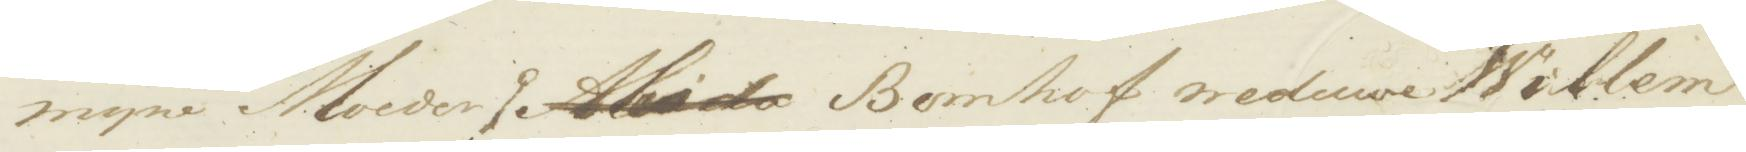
myne Moeder ¶ Aleida Bomhof weduwe Willem
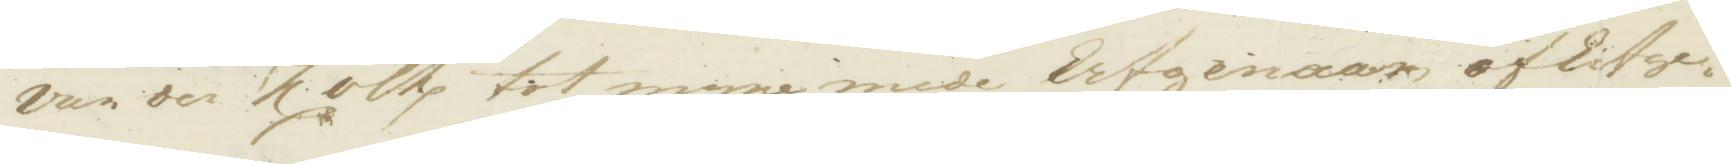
van der Kolk tot myne mede Erfgenaam of Erfge„
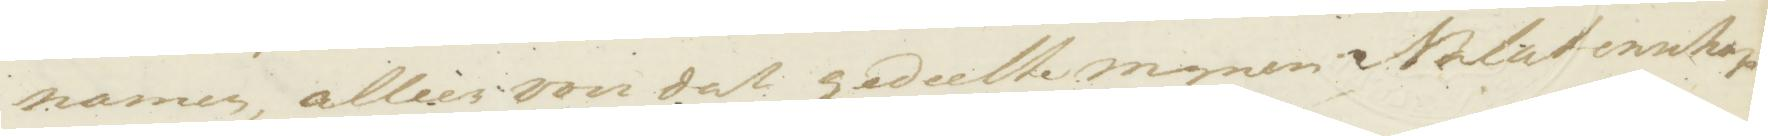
namen, alleen voor dat gedeelte mynen Nalatenschap
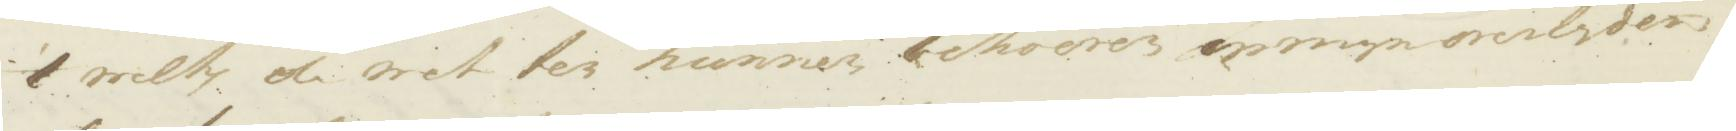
't welk de wet ten hunnen behoeven op myn overlyden
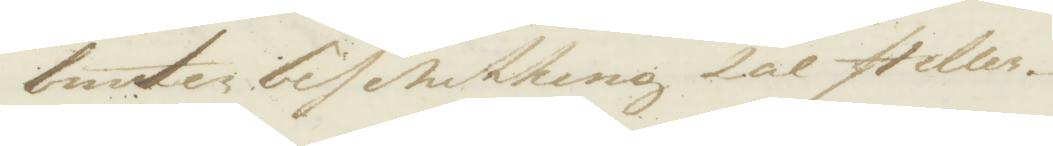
buiten beschikking zal stellen.
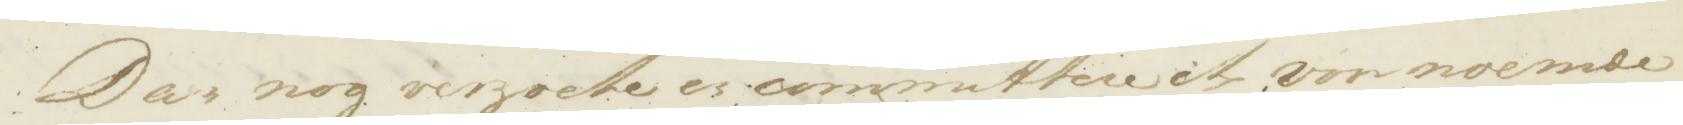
Dan nog verzoeke en committere ik, vor noemde
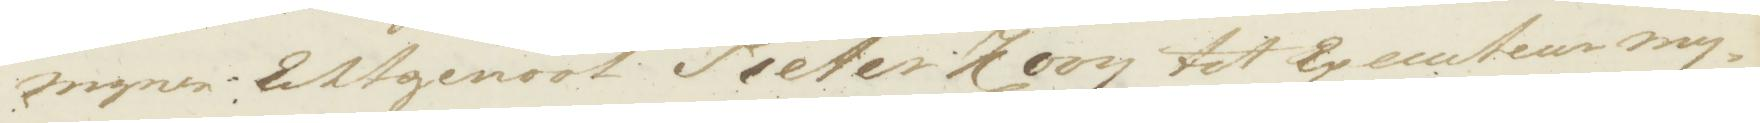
mynen Echtgenoot Pieter Kooy tot Executeur my=
